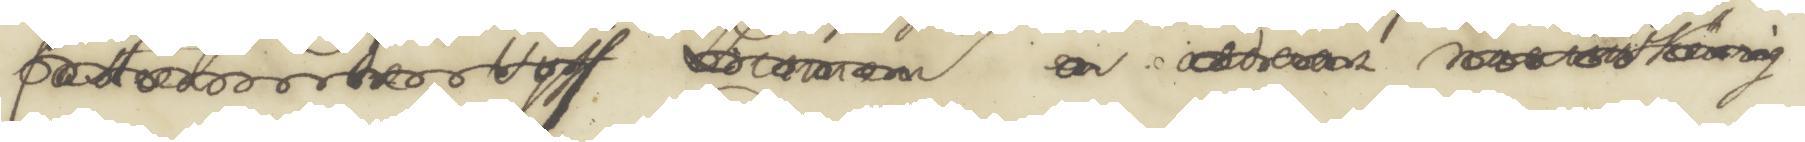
Casteel de herstyff Lotqaam en aldaar nae waarsts heaung
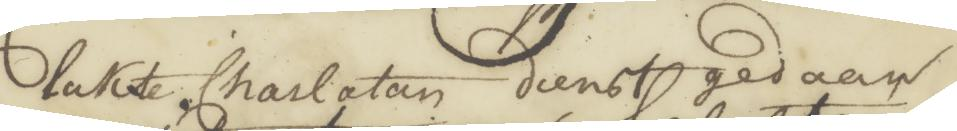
lukte Charlatan dienst gedaan
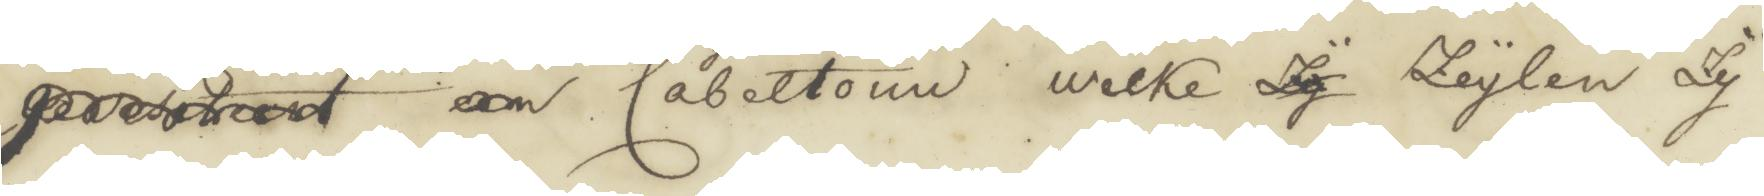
geadsiteert een Cabeltouw welke zij zeijlen zij
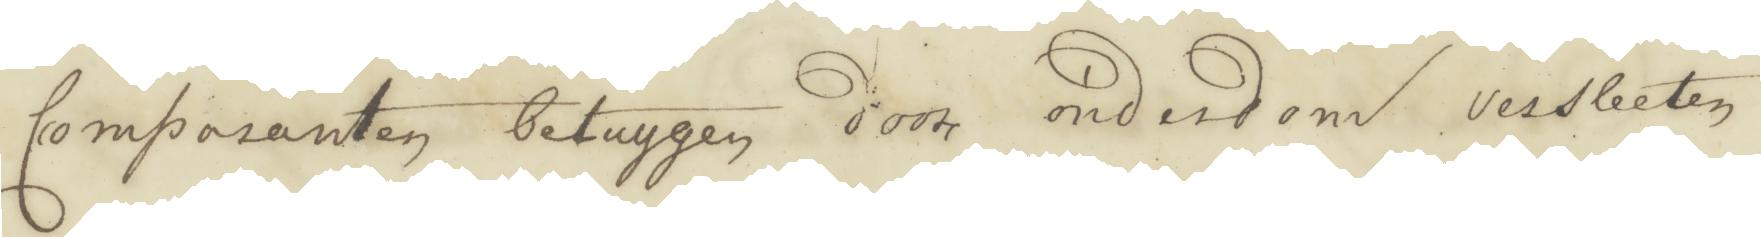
comparanten betuygen door ouderdom versleeten
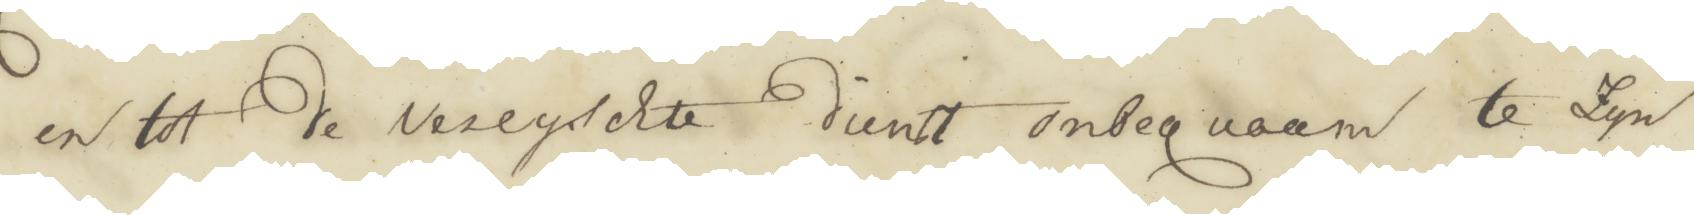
en tot de vereyschte dienst onbequaam te zyn
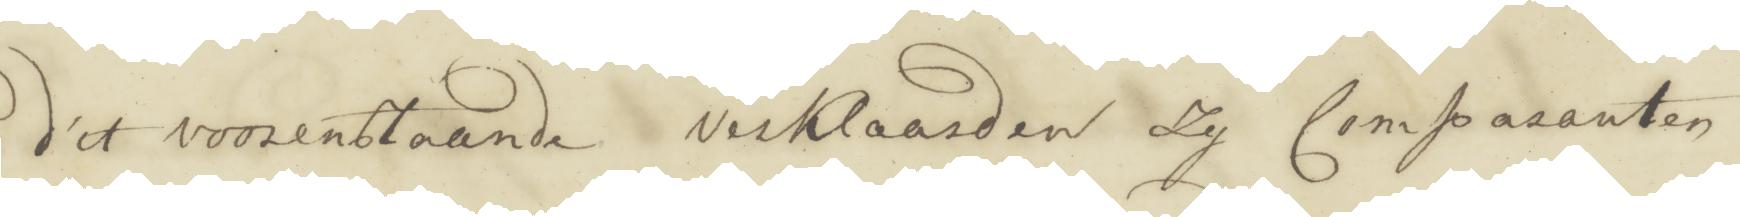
dit voorenstaande verklaarden zy Comparanten
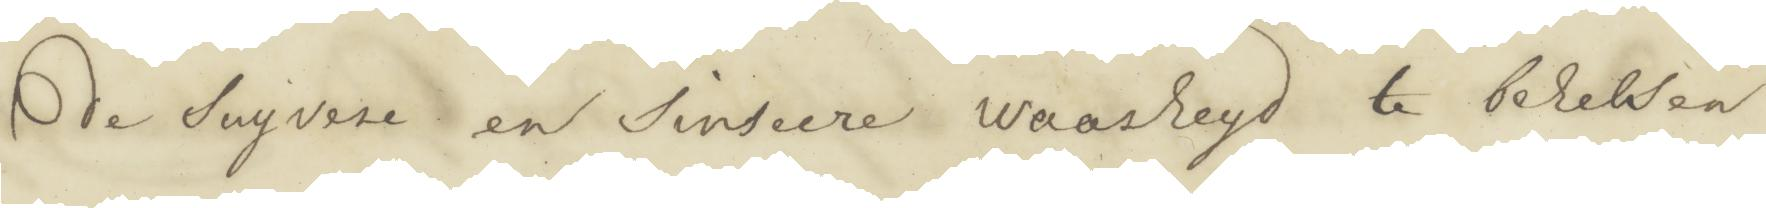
de suyvere en sinseere waarheyd te behelsen
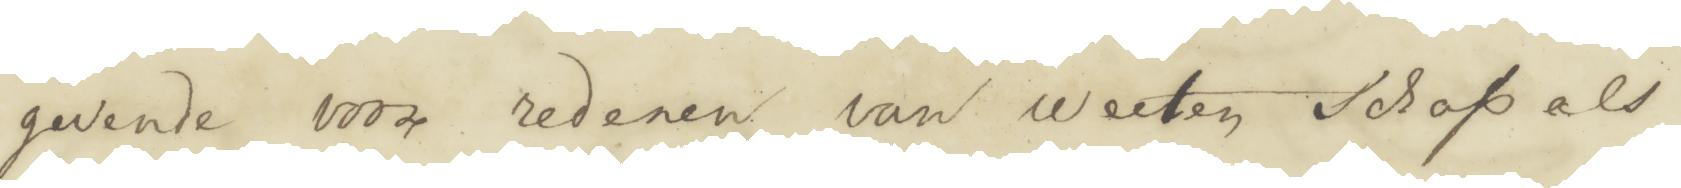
gevende voor rederen van weeten schap als
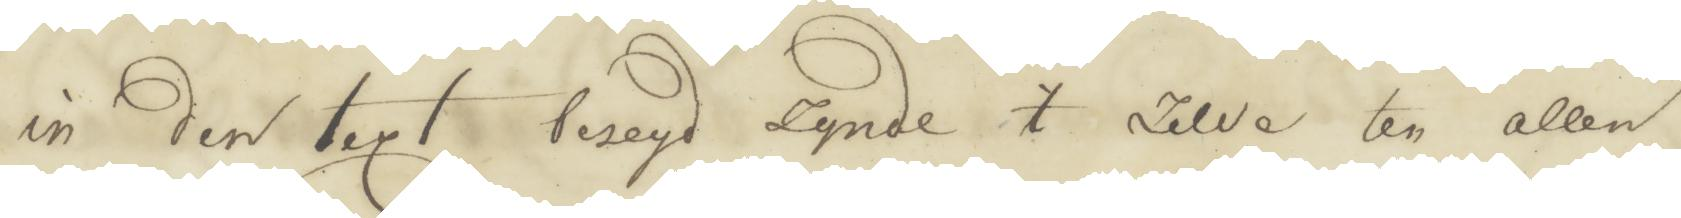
in den text beseyd zynde ’t zelve ten allen
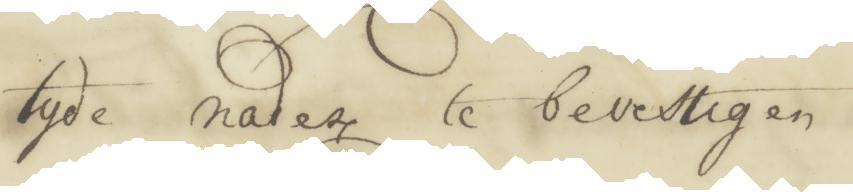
tyde nader te bevestigen
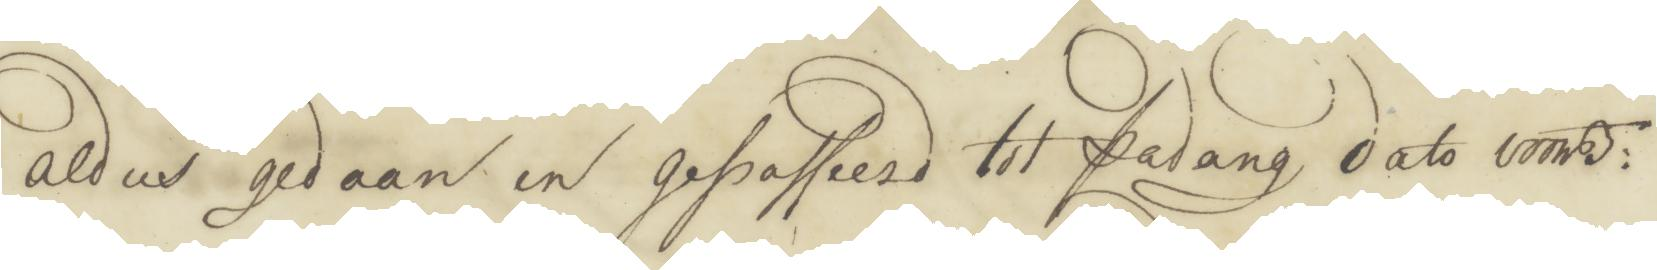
aldus gedaan en gepasseerd tot padang dato voorsz:
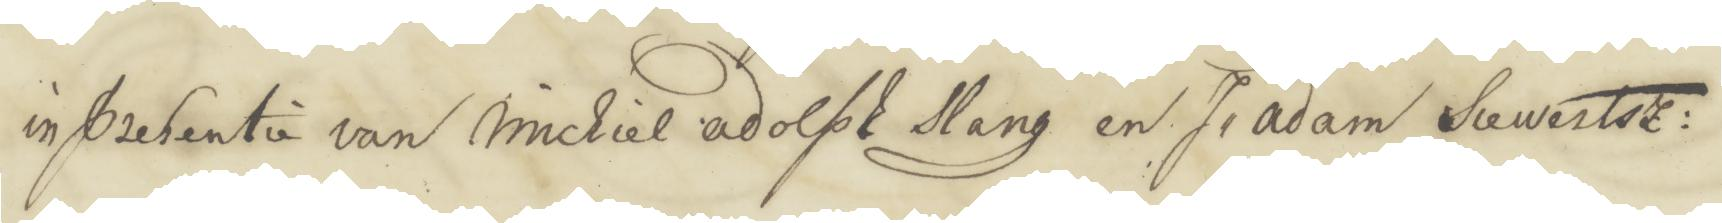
in presentie van michiel adolph slang en J„adam siewertsz:
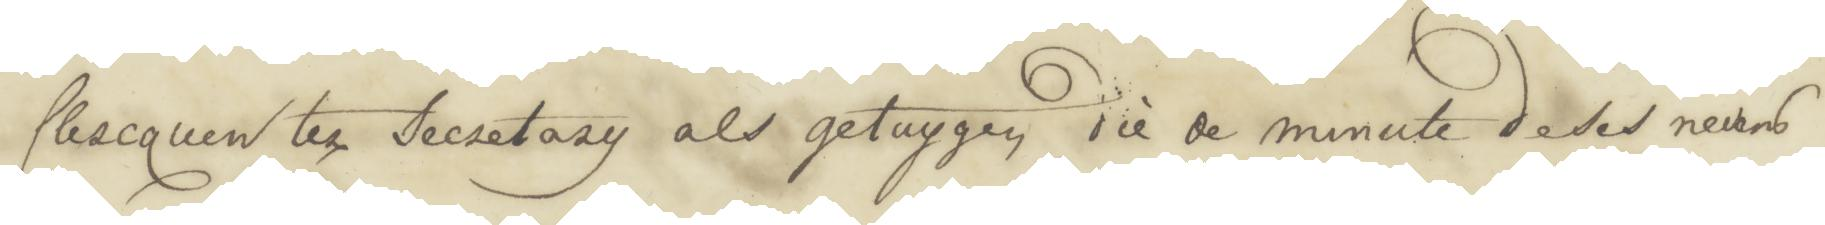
Clercquen ter secretary als getuygen die de minute deses nevens
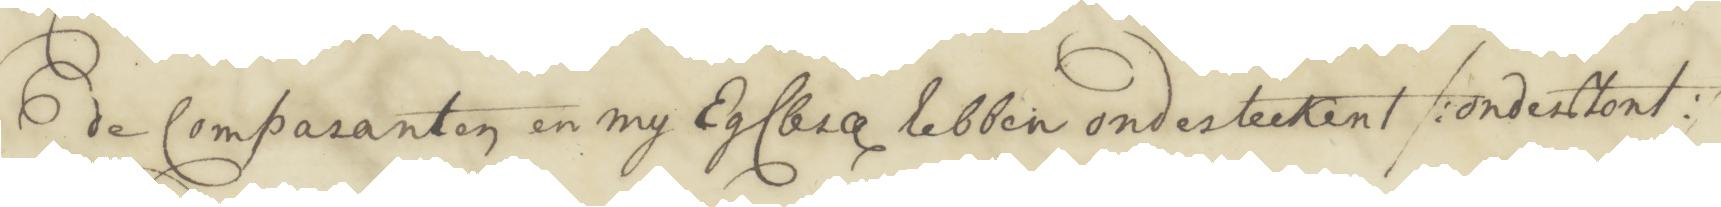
de Comparanten en my Eg clerq hebben onderteekent /: onderstont :/
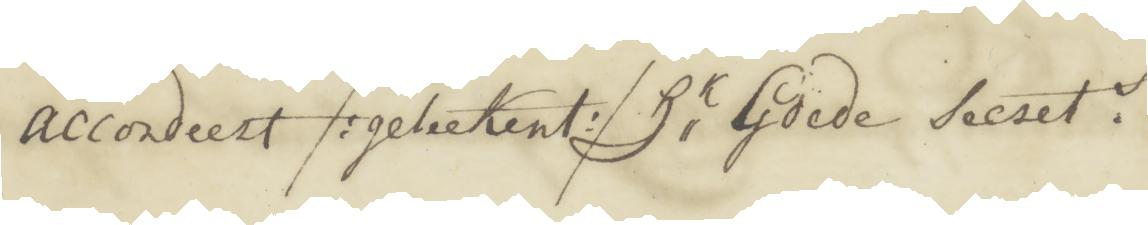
accordeert /: geteekent: / H„r Goede secret.s
